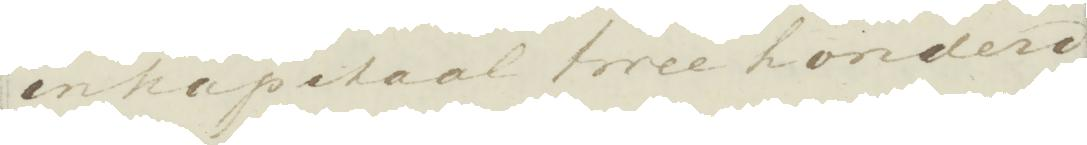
inkapitaal twee honderd
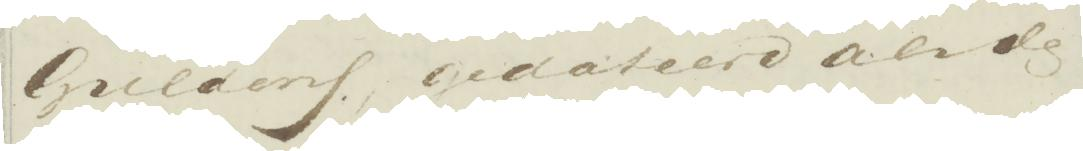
Guldens, gedateerd als de
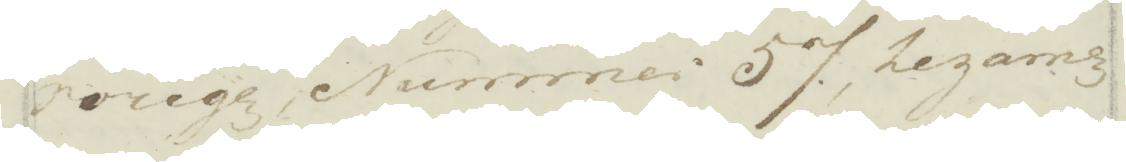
vorigen, Nummer 57, tezamen
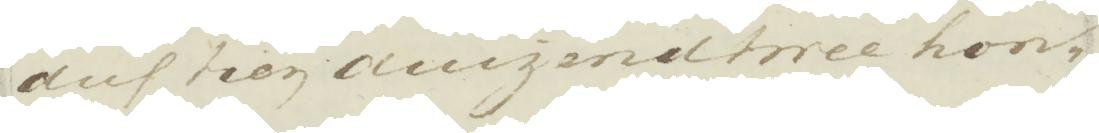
dus tien duizend twee hon„
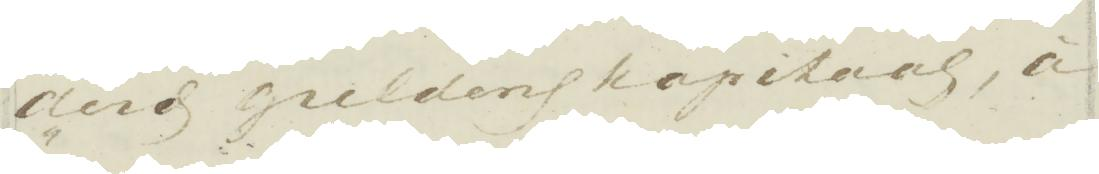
„derd guldens kapitaal, à
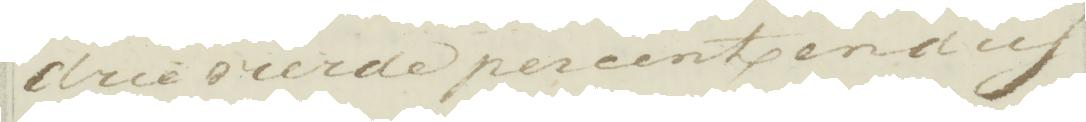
drie vierde percent en dus
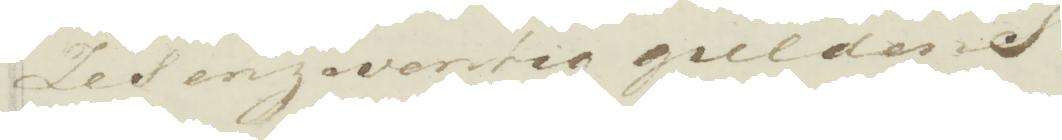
Zes en zeventig guldens
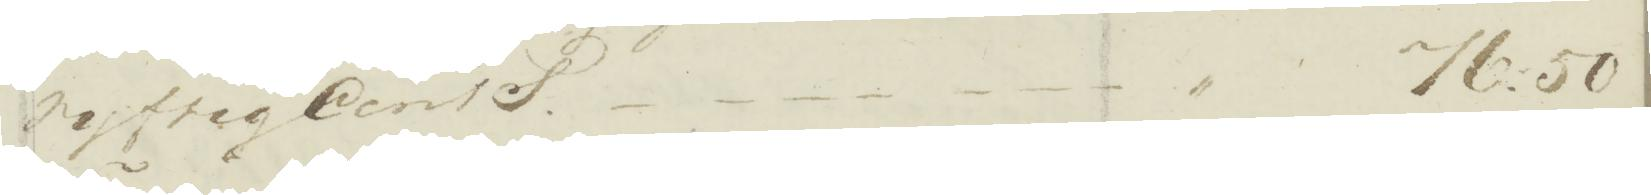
Vyftig Cents. - - - - - - - „ 76:50
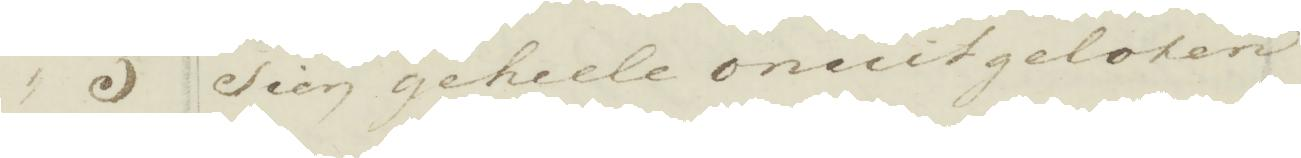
„ 5 Tien geheele onuitgeloten
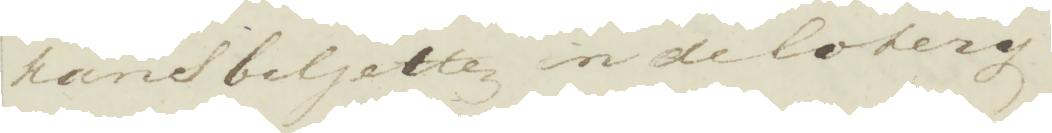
kansbiljetten in de lotery
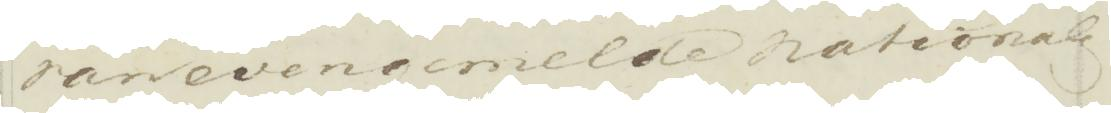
van evengemelde nationale
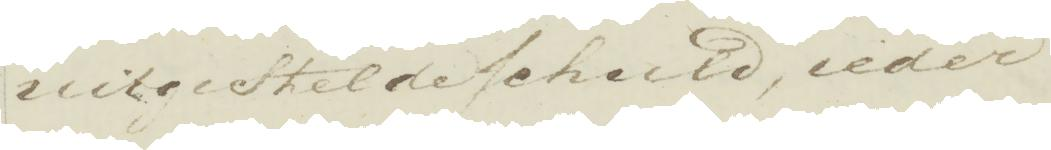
uitgestelde schuld, ieder
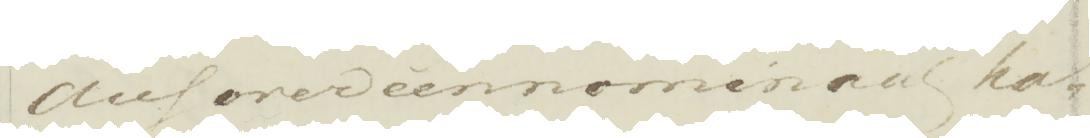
dus over eennominaal ka„
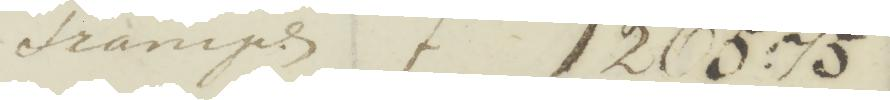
Transp:en ƒ 1265:75
